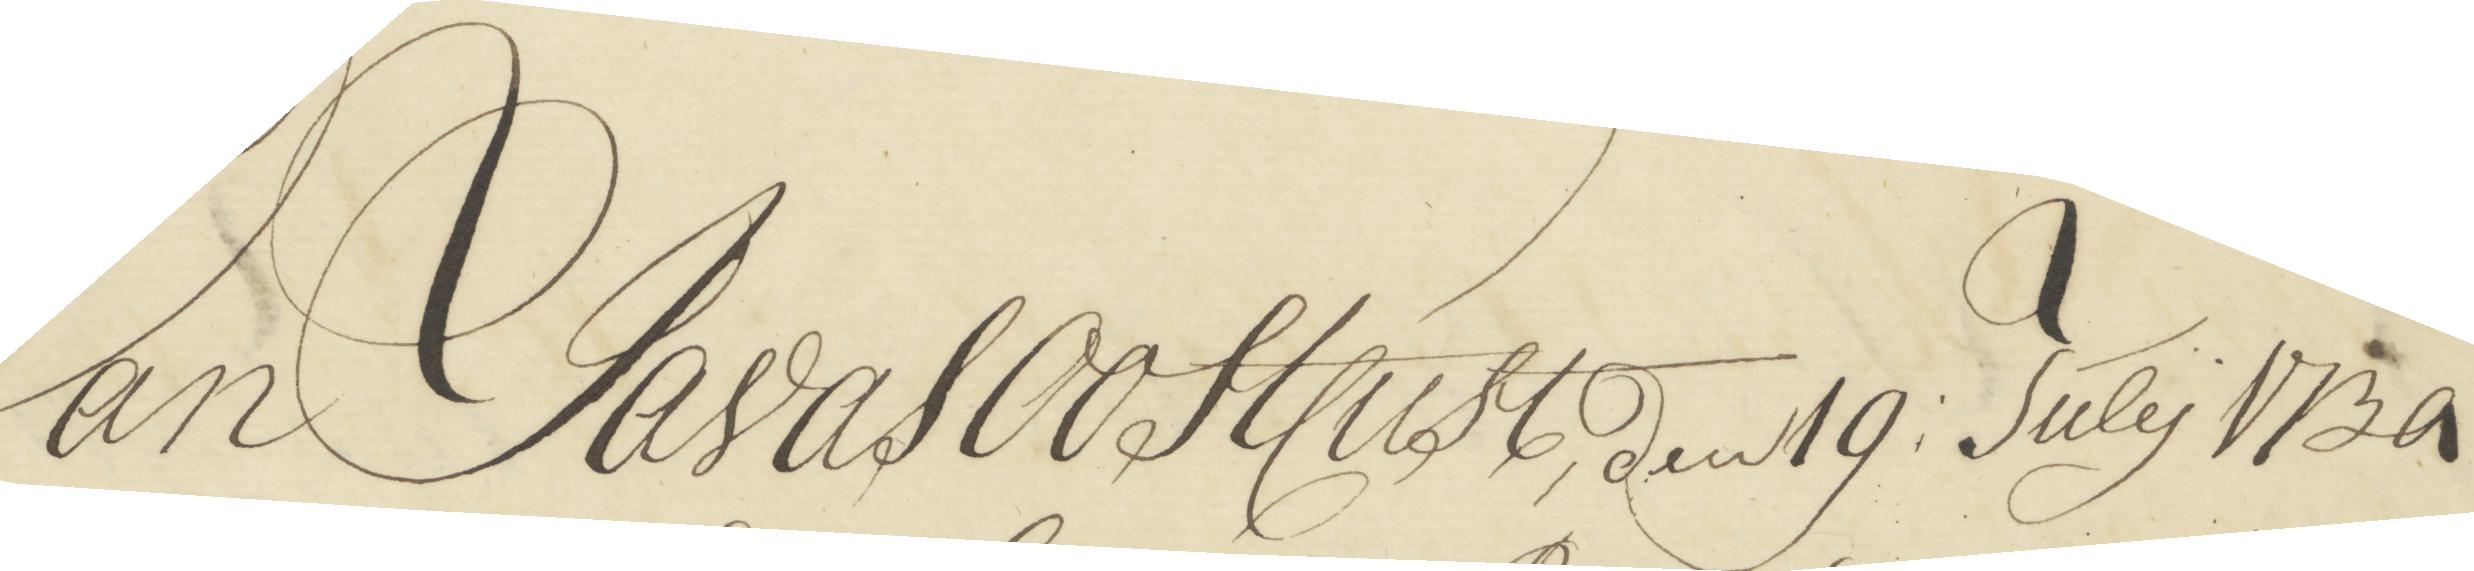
Van Javas Oostcust, den 19: Iulij 1734
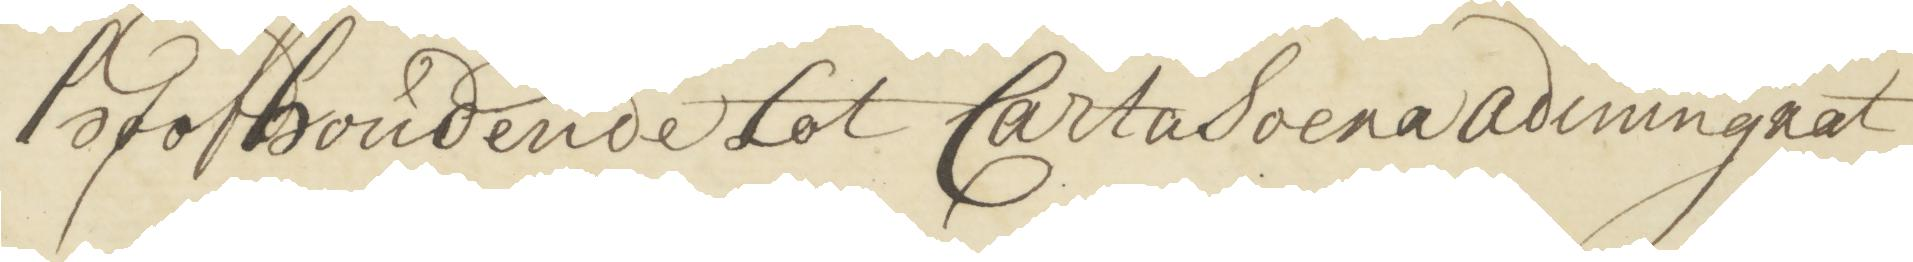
hoofhoudende tot Cartasoena adiningrat
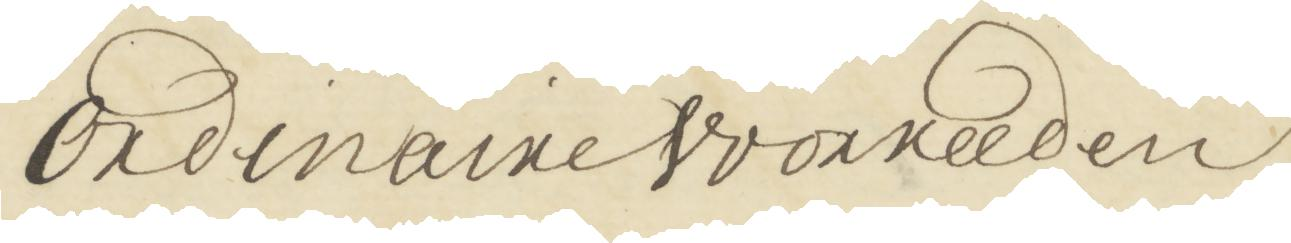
Ordinaire voorreeden
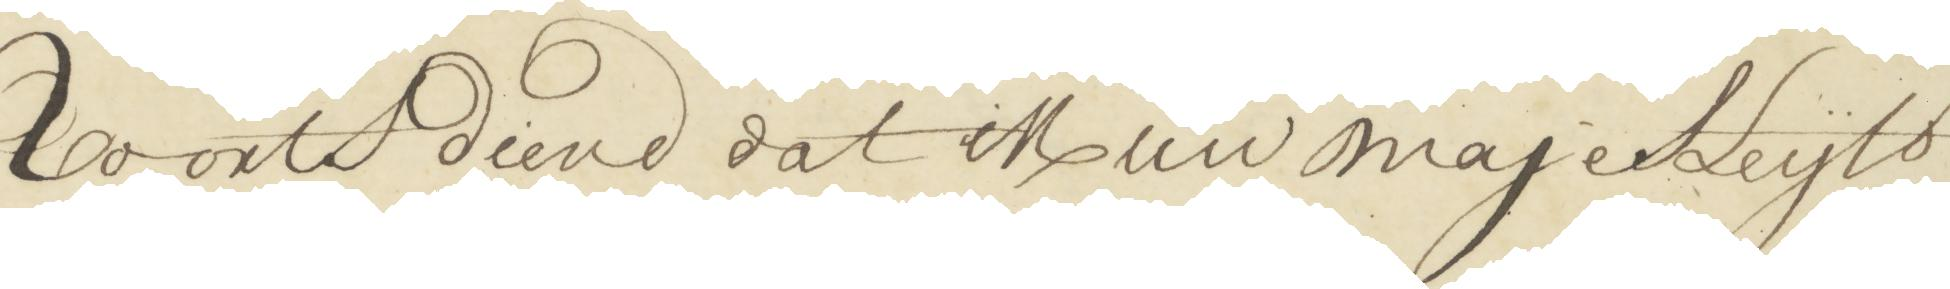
Voorts diend dat ik uw majesteijts
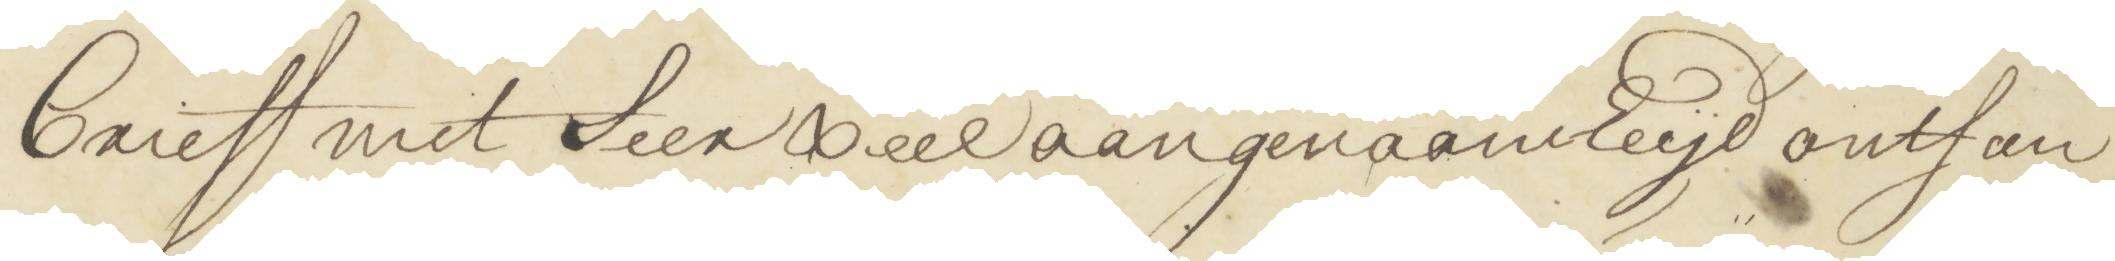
brieff met seer veel aangenaamheijd ontfan
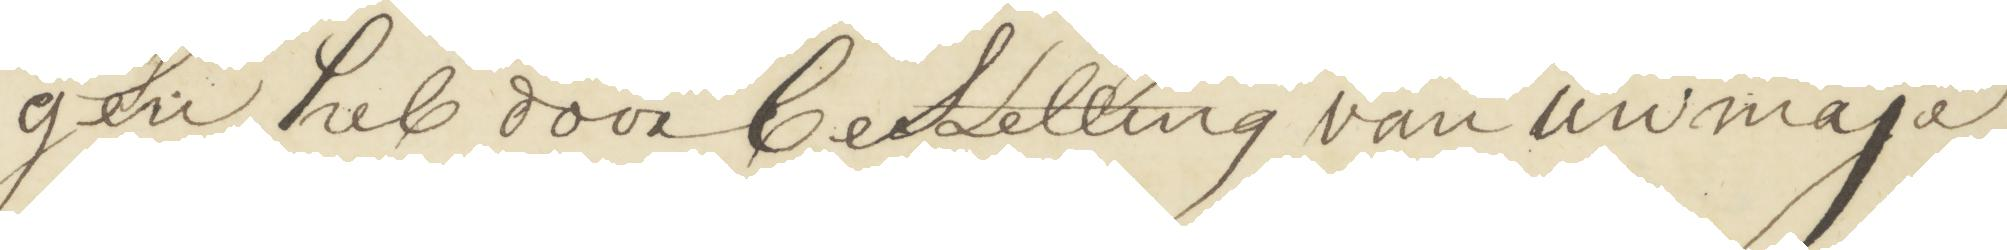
gen heb door bestelling van uw maje
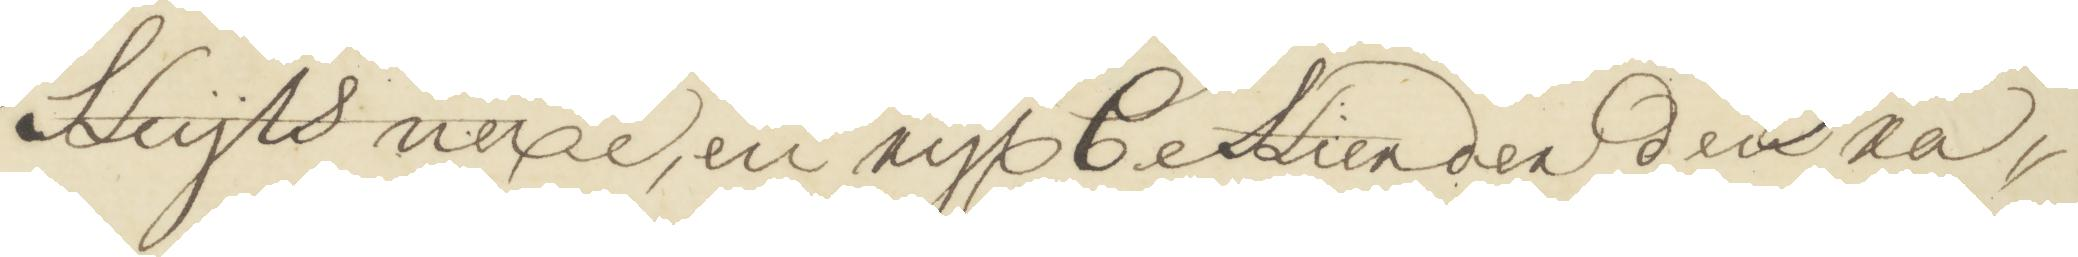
steijts neve, en rijx bestierder den ra„
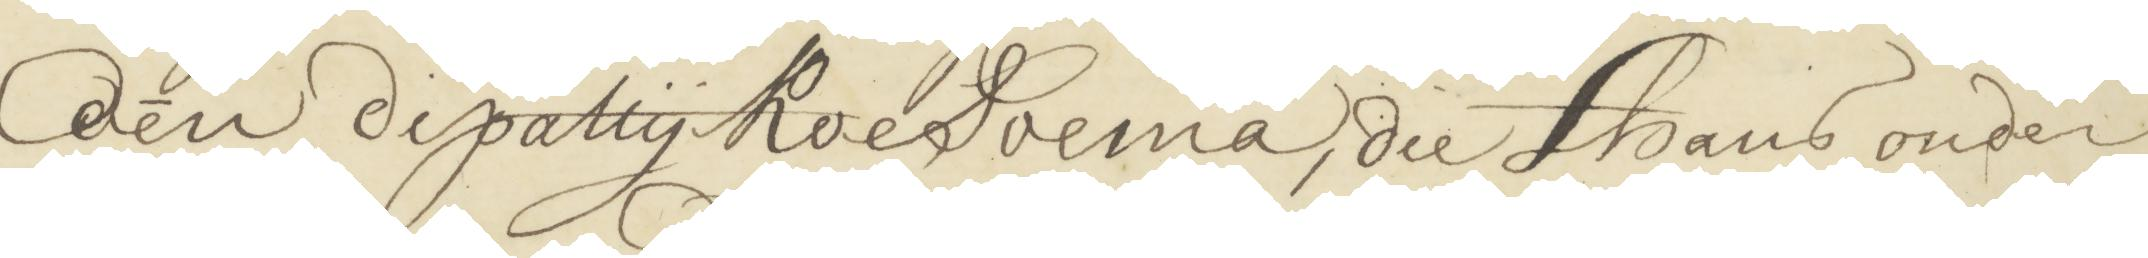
den dipattij Koesoema, die thans onder
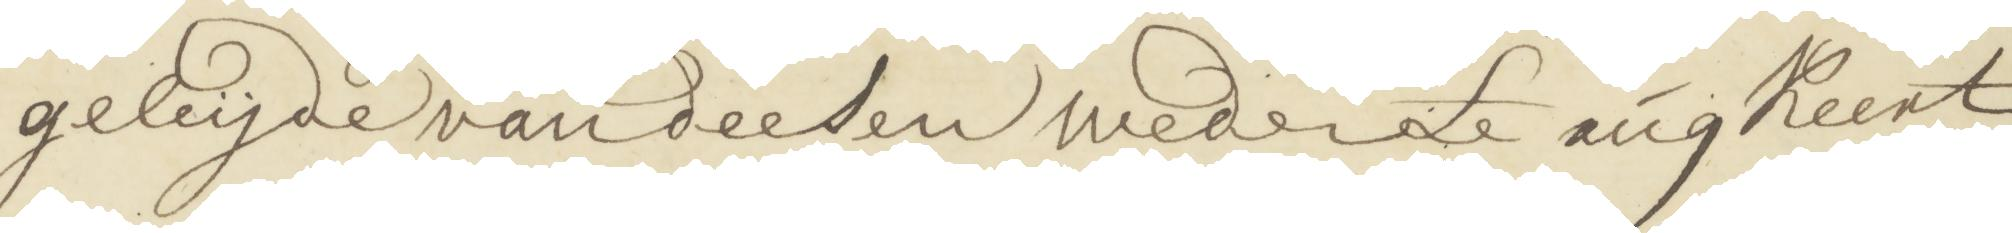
geleijde van deesen weder te rugkeert
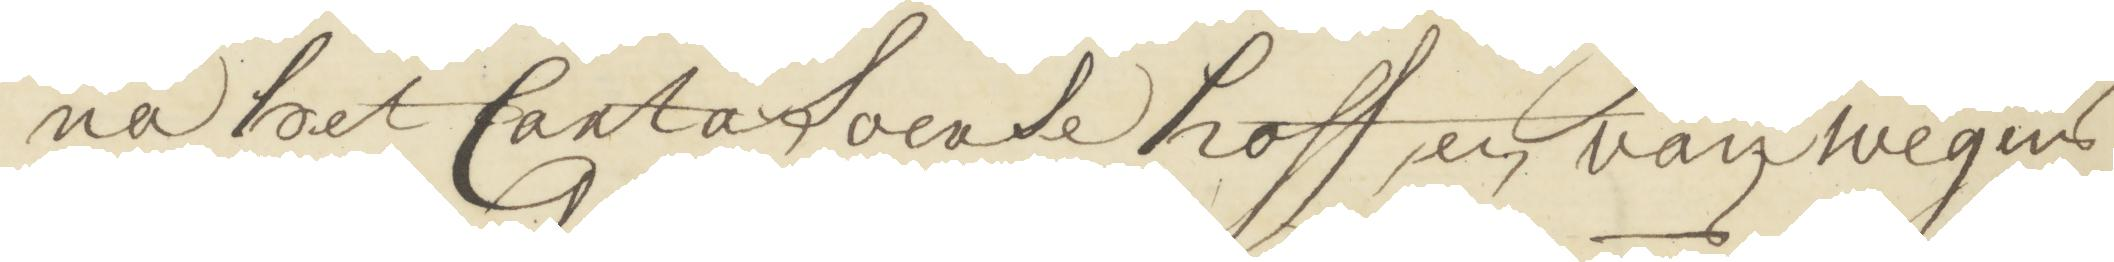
na het Cartasoerse hoff, en van wegens
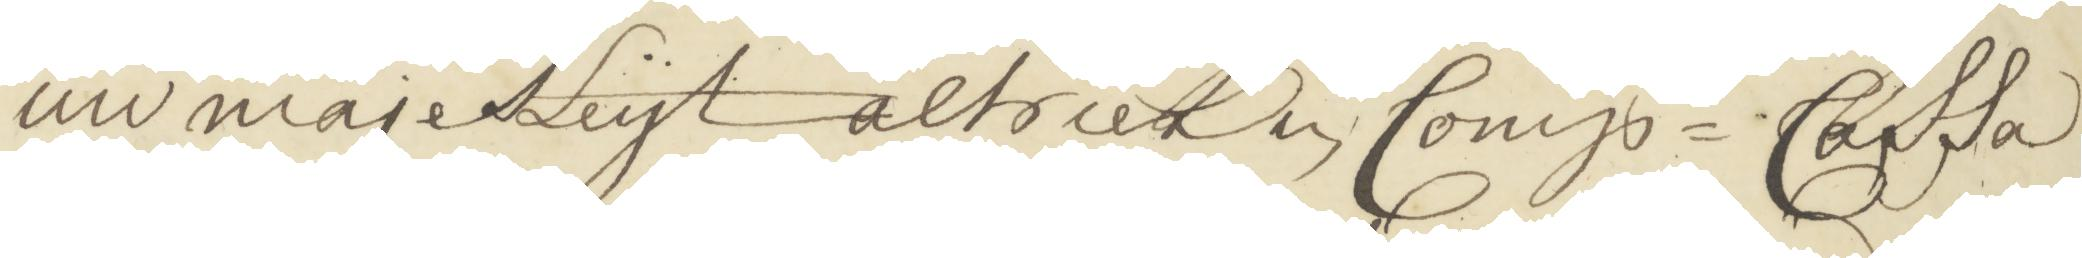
uw majesteijt alhier in Comp=s Cassa
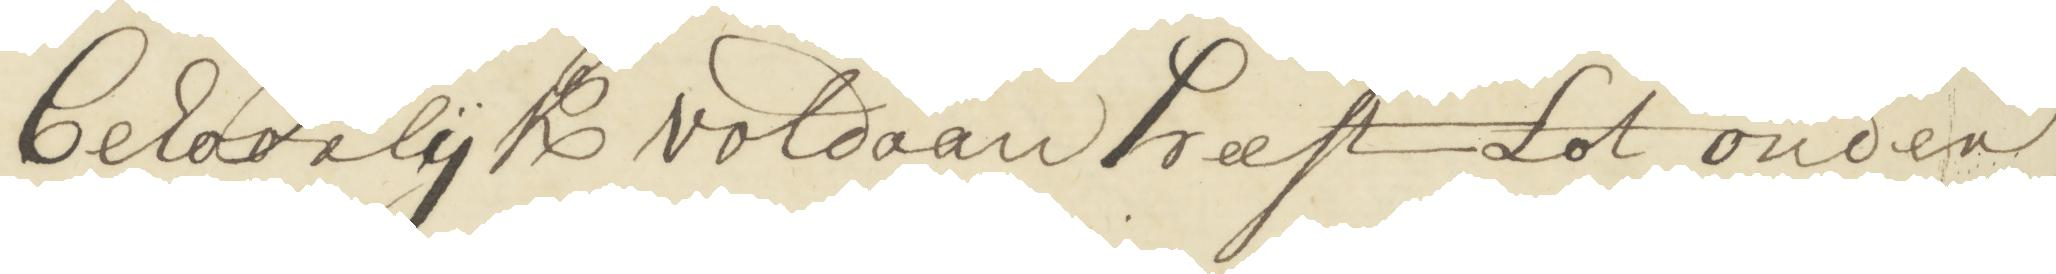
behoorlijk voldaan heeft tot onder
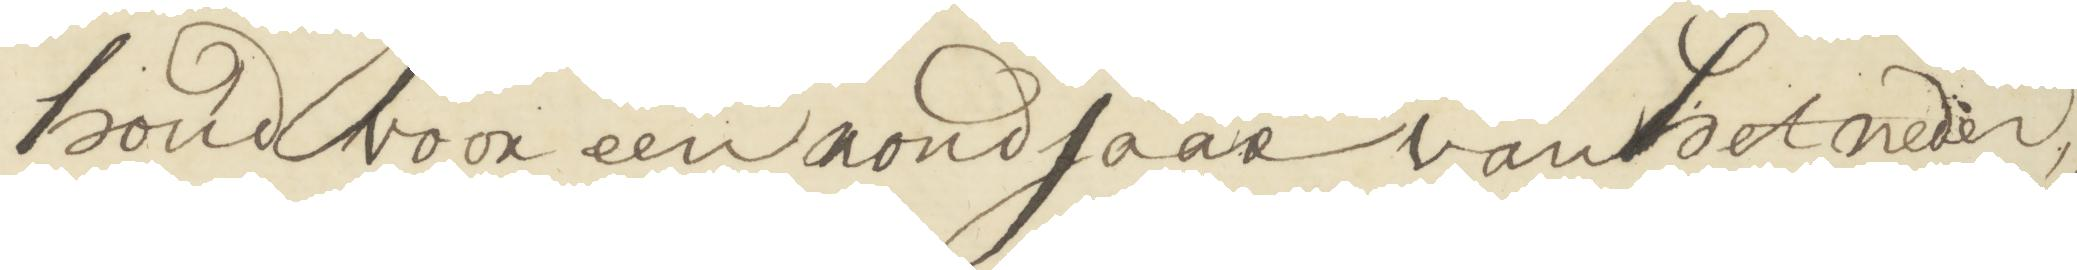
houd voor een rondjaar van het neder
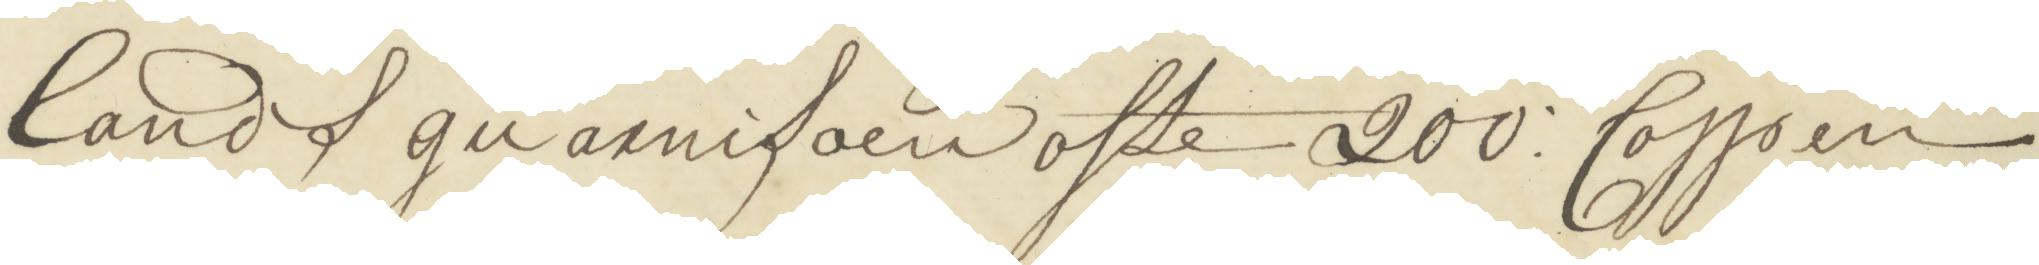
lands guarnisoen ofte 200: Coppen
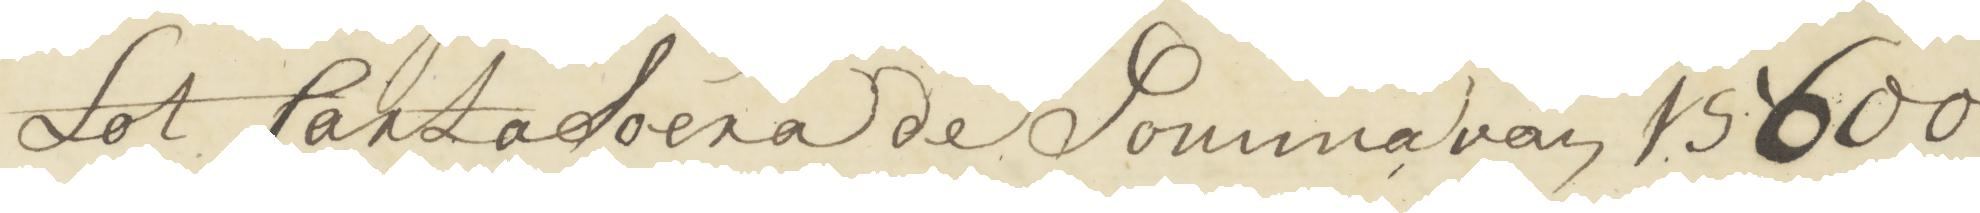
tot Cartasoera de Somma van 15600
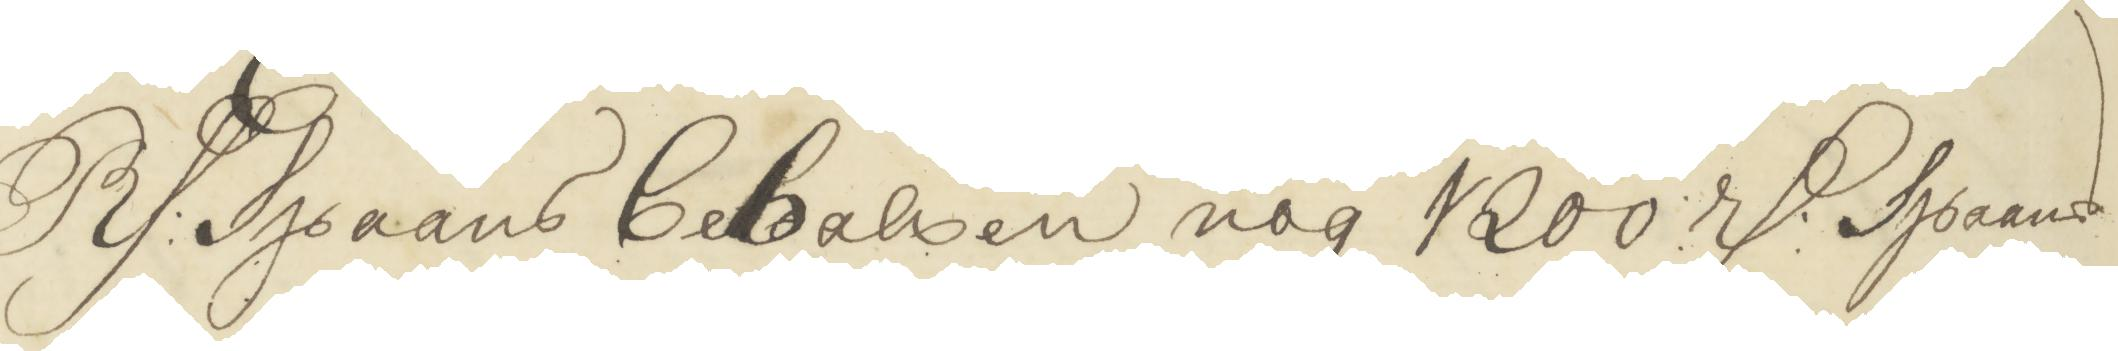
Rs: spaans behalven nog 1200: rs: spaans
